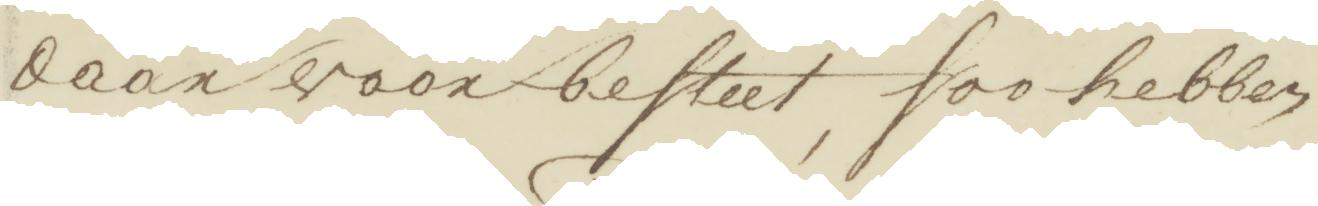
daar voor besteet, Soo hebben
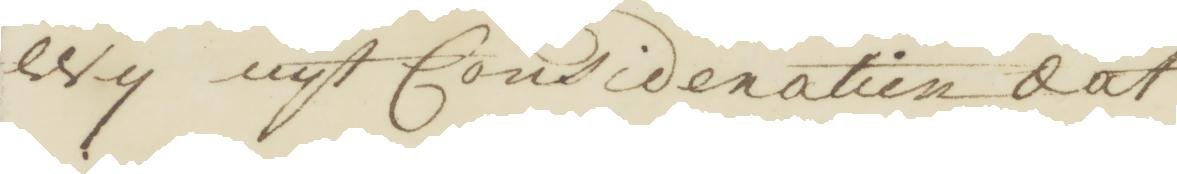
wij uijt Consideratien dat
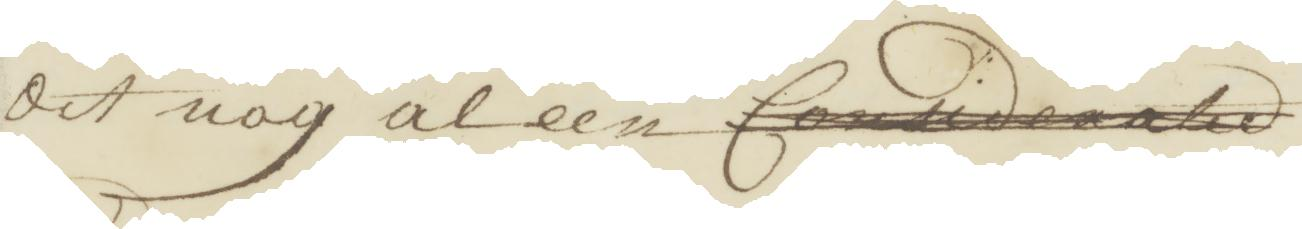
dit nog al een Consideratie
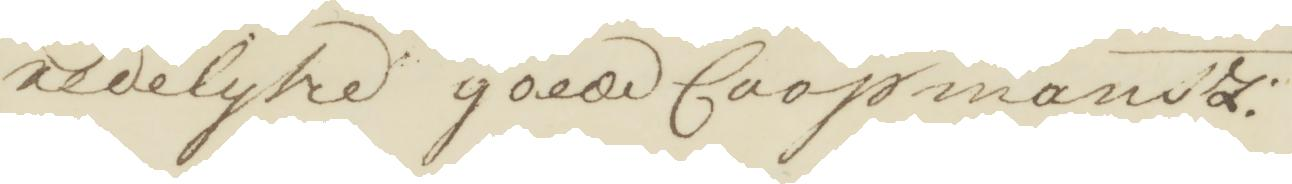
redelijke goede Coopmansz:
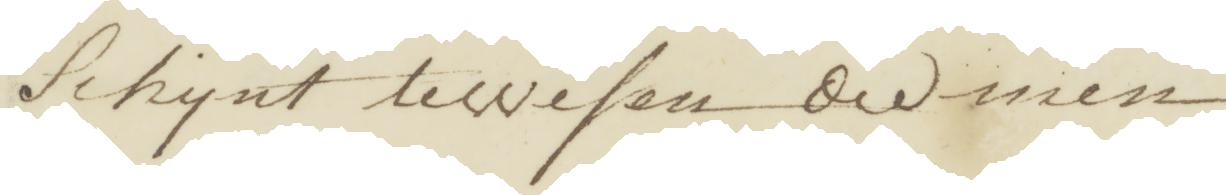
Schijnt te wesen die men
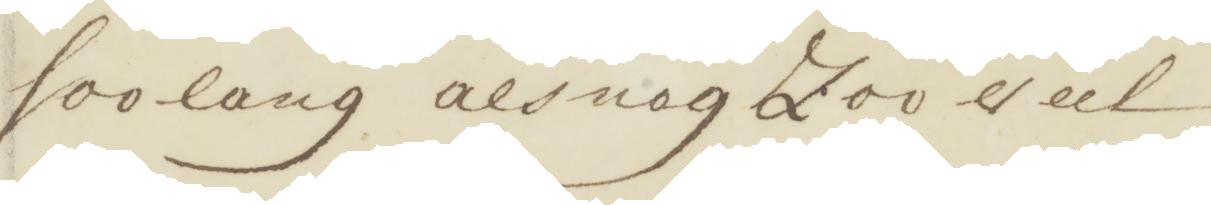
Soo lang als nog Zoo veel
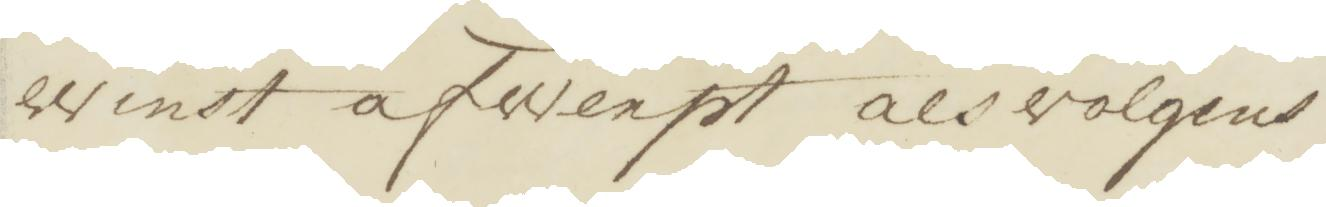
winst afwerpt als volgens
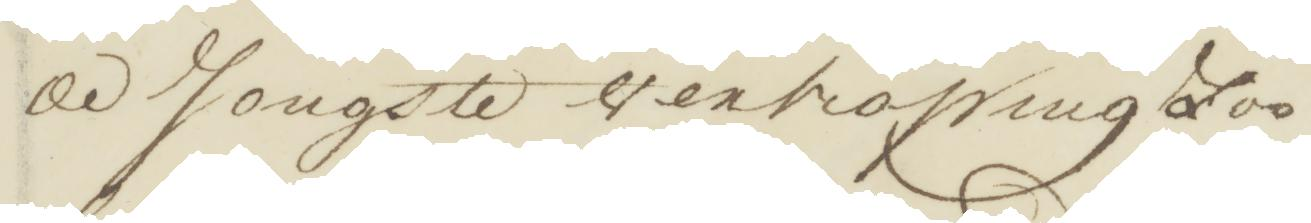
de Jongste verkoping Zoo
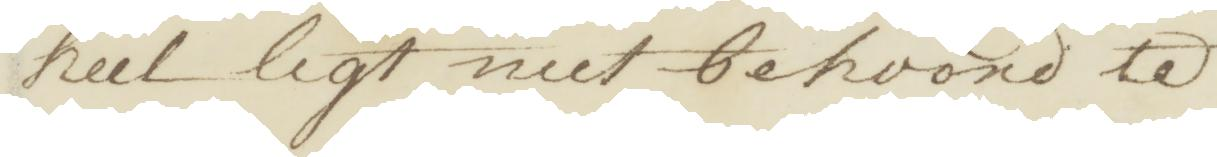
heel ligt niet behoord te
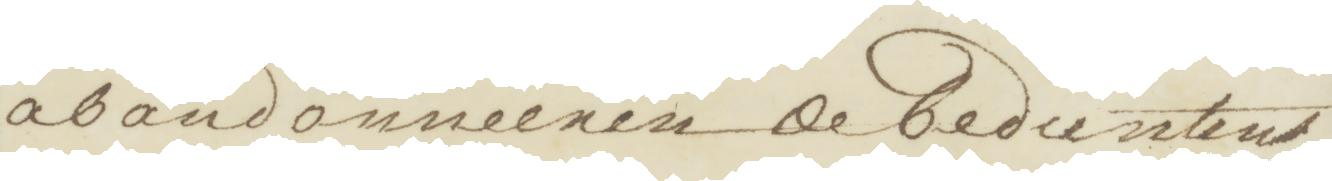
abandonneeren de bedientens
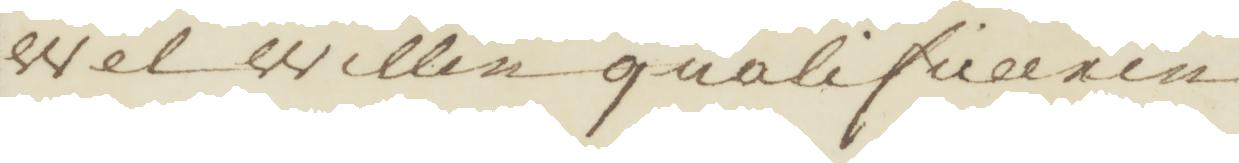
wel willen qualificeeren
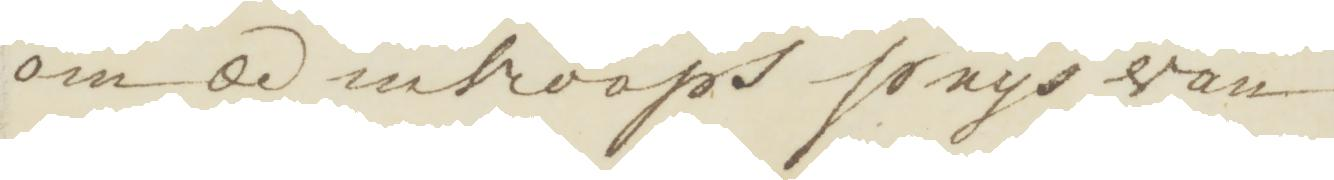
om de inkoops prijs van
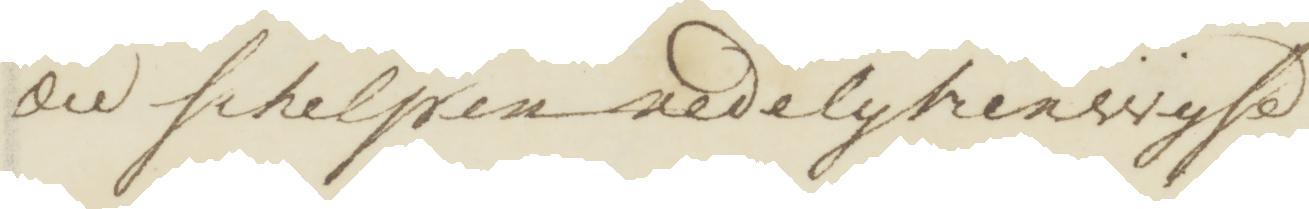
die Schelpen redelyker wijse
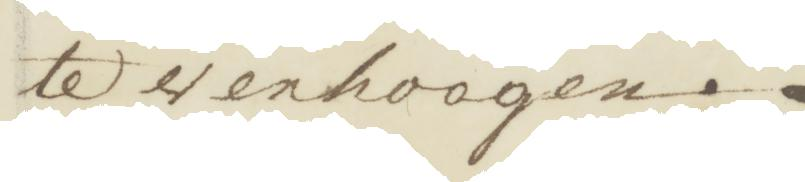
te verhoogen.
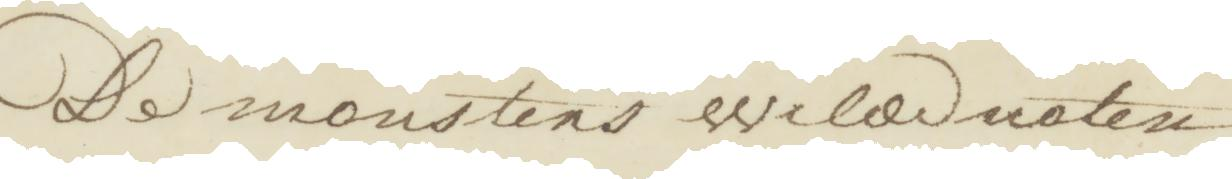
De monsters wilde noten
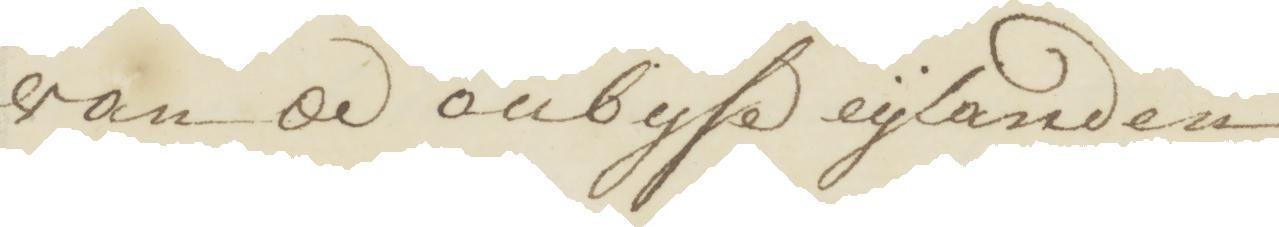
van de oubijse eijlanden
